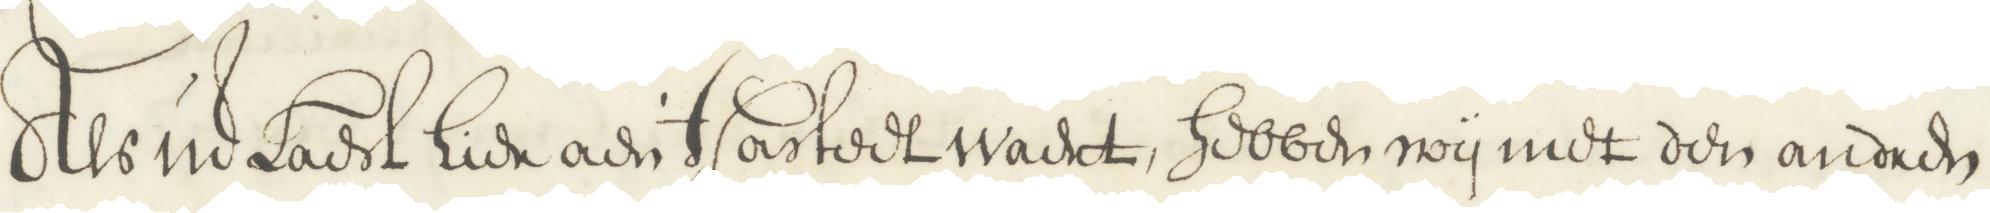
Als uE Laest hier aen ’t Casteel waert, hebben wij met den andren
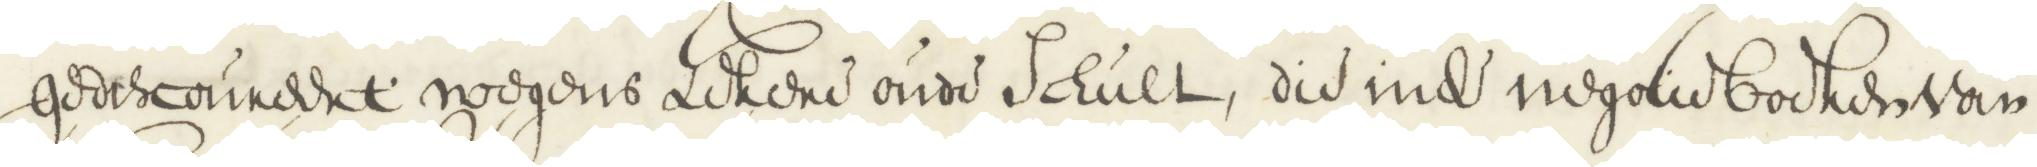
gediscoureert wegens zekere oude schult, die inde negotie boeken van
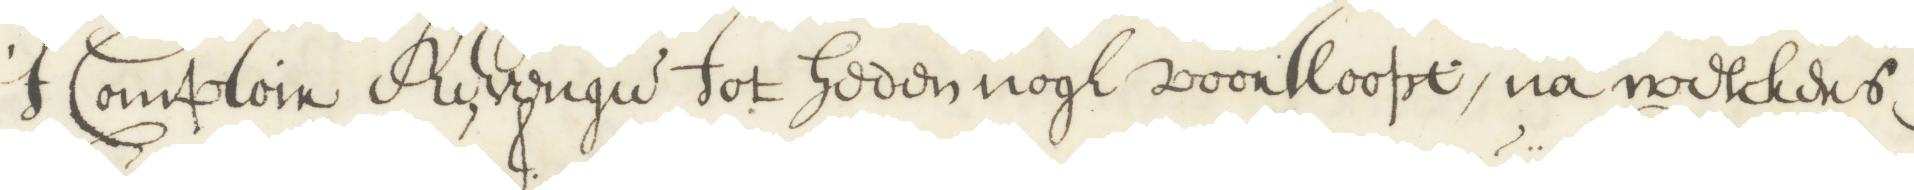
’t Comptoir Revengie tot heden nogh voortloopt, na welckers
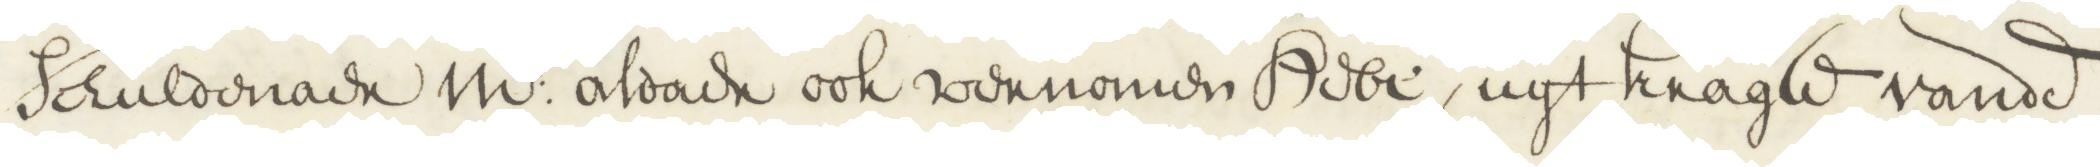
schuldenaer uE: aldaer ook vernomen Hebt, uijt kragte vande
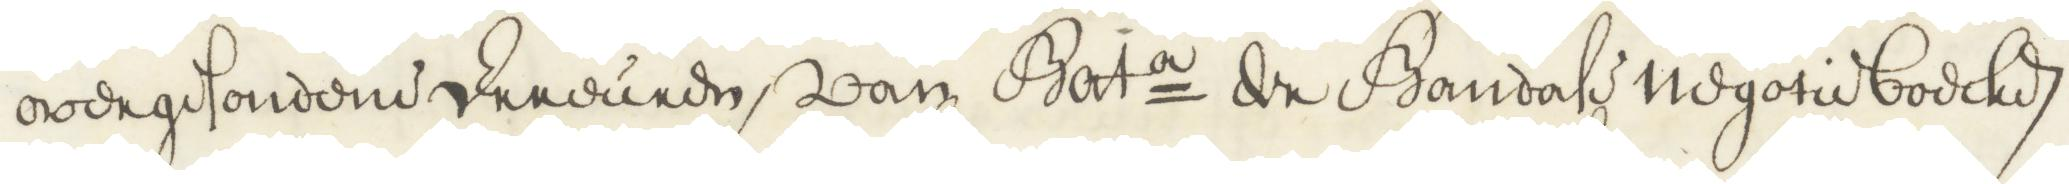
overgesondene erreuren, van Bat=a der Bandase negotie boecken
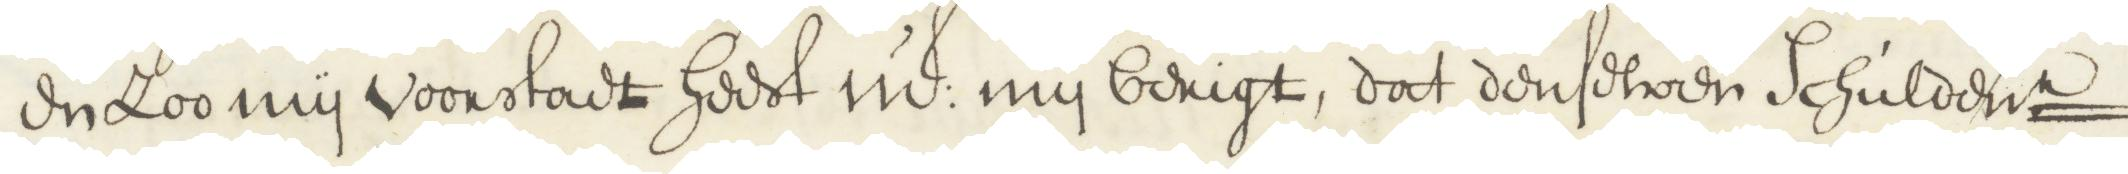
en zoo mij voorstaet heeft uE: mij berigt, dat denselven schulden=r
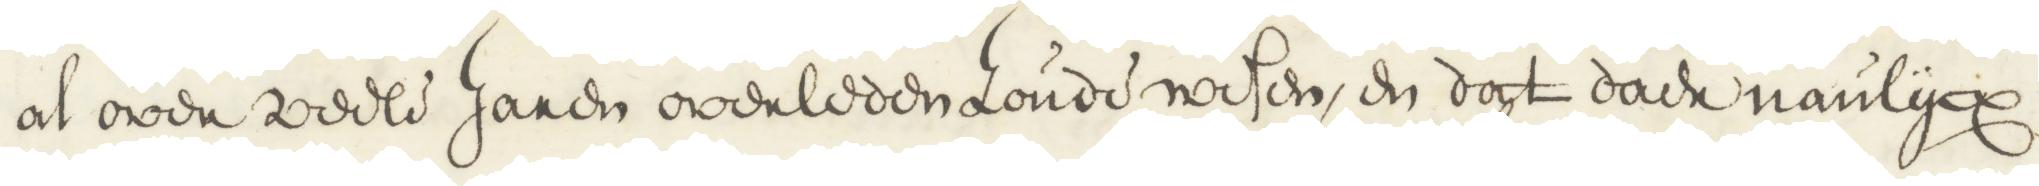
al over veele Jaren overleden zoude wesen, en dat daer naulijcx
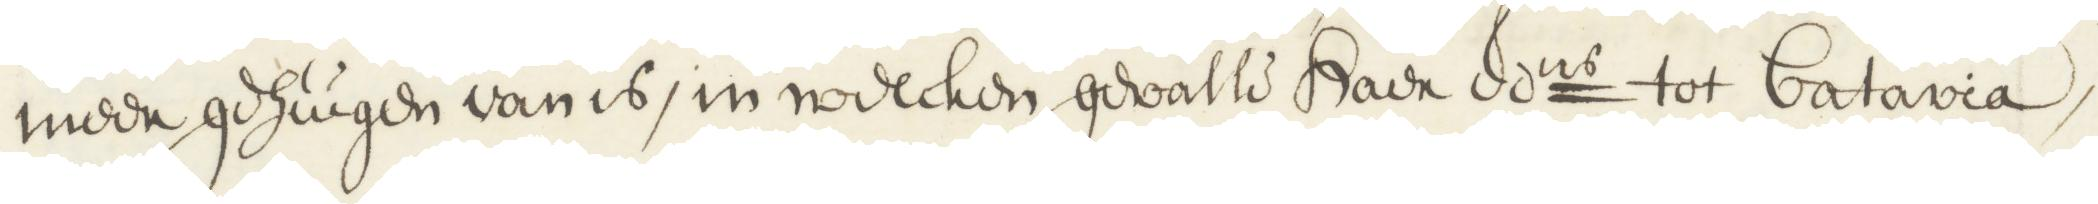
meer geheugen van is, in welcken gevalle Haer Ed=ns tot batavia,
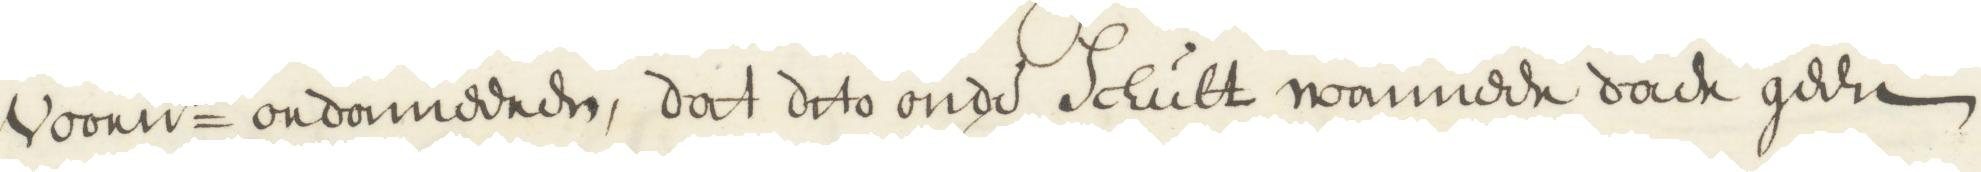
voorn=t ordonneeren, dat dito oude schult wanneer daer geen
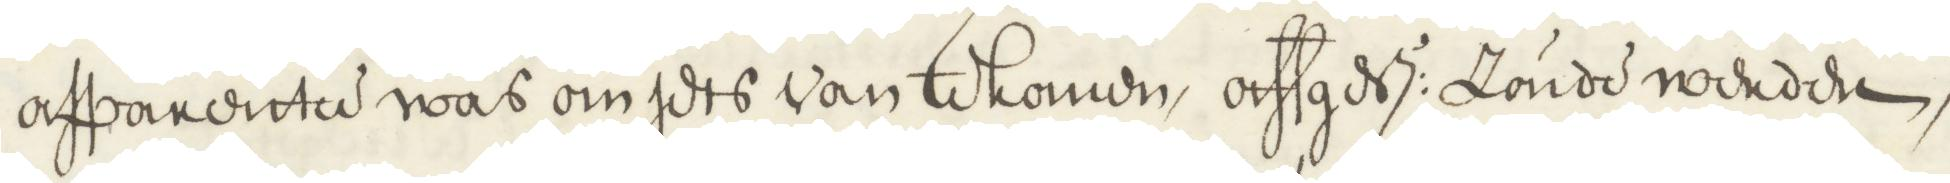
apparentie was om jets van tekomen, affgesz: zoude werden,
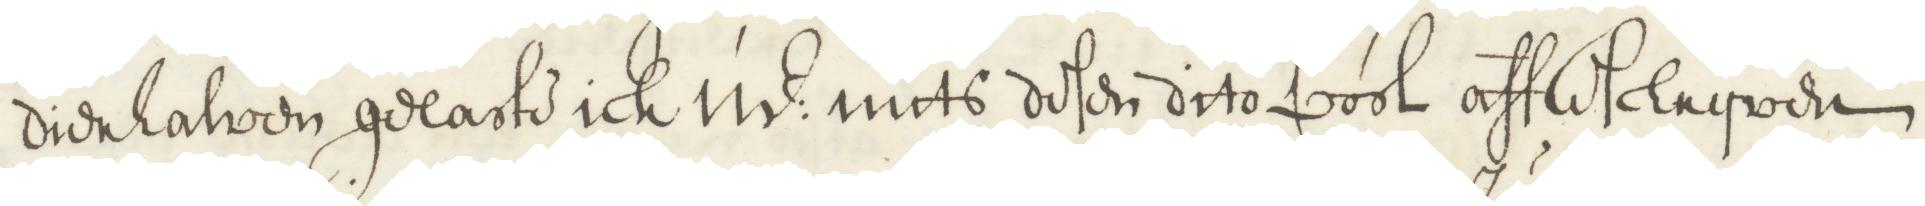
dierhalven gelaste ick uE: mits desen dito post affteschrijven
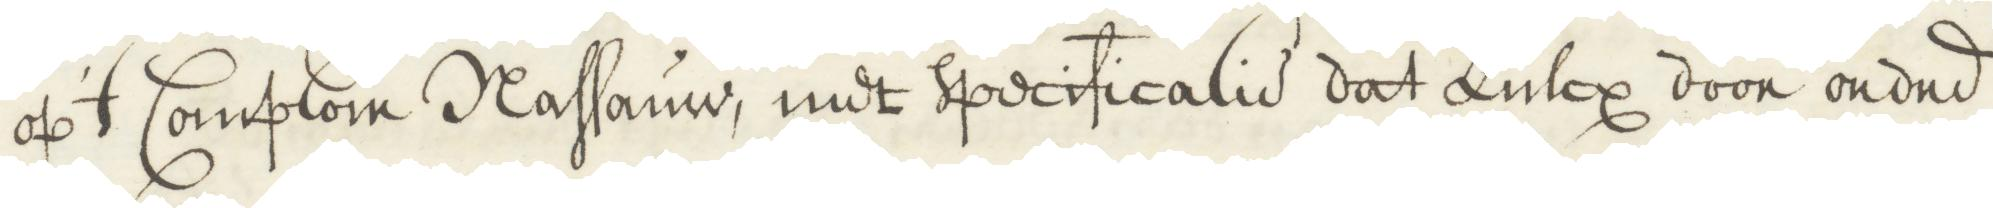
op ’t Comptoir Nassauw, met specificatie dat zulcx door ordre
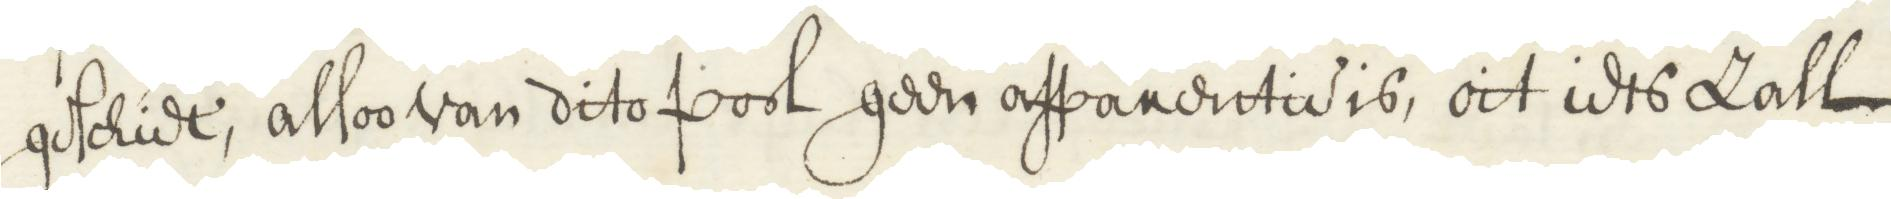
geschiet, alsoo van dito post geen apparentie is, dit iets zall
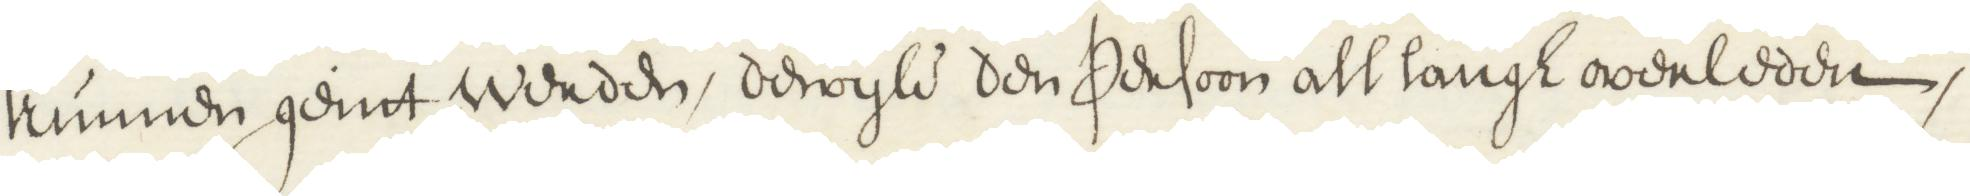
kunnen geint werden, dewijle den persoon all langh overleden,
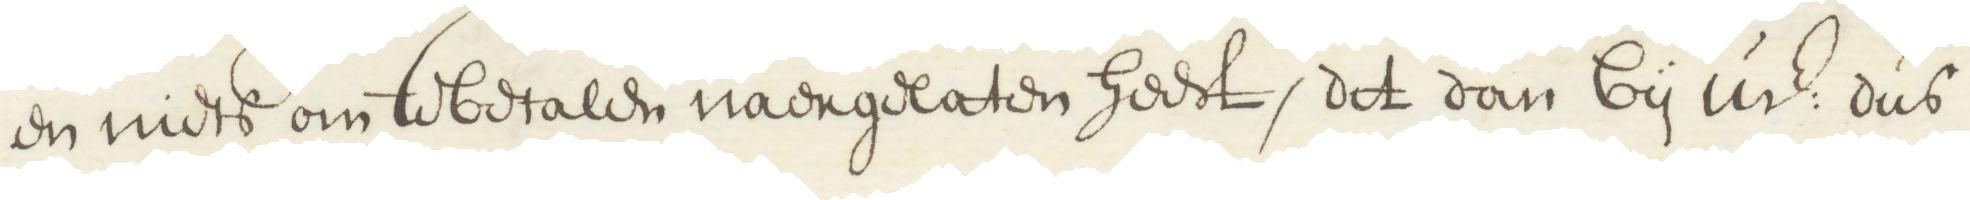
en niets om tebetalen naergelaten heeft, dit dan bij uE: dus
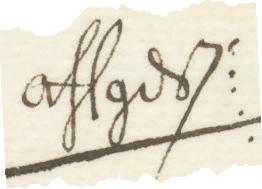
affgesz:
